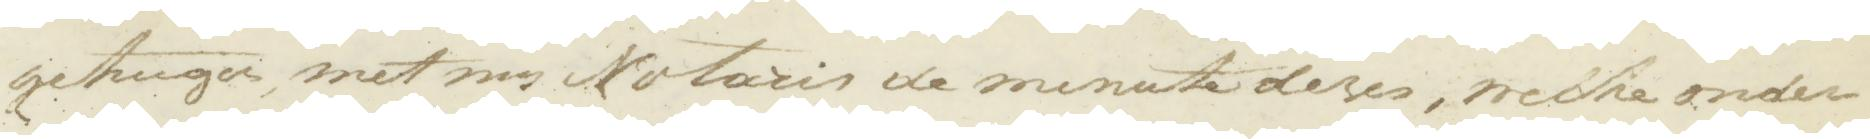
getuigen, met my Notaris de minute dezes, welke onder
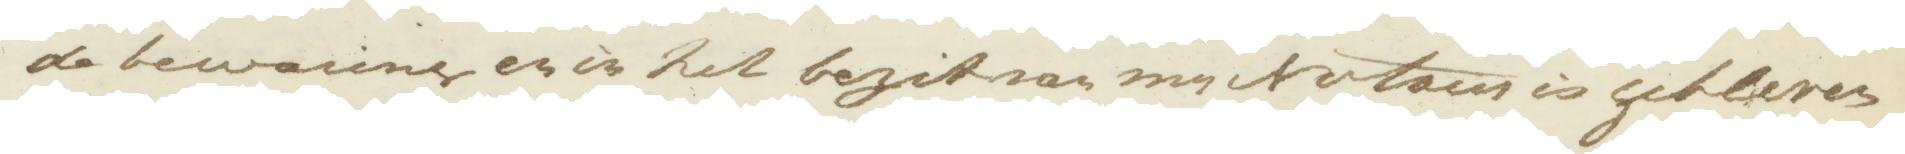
de bewaring en in het bezit van my Notaris is gebleven
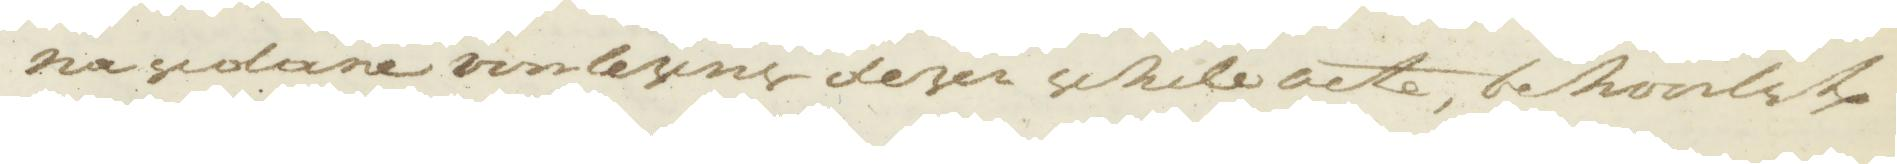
na gedane voorlezing dezer gehele acte, behoorlyk
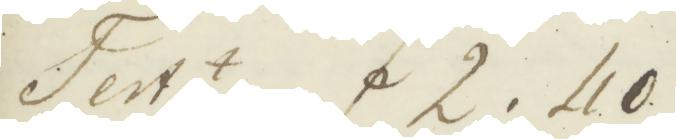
Test=t ƒ 2„ 40
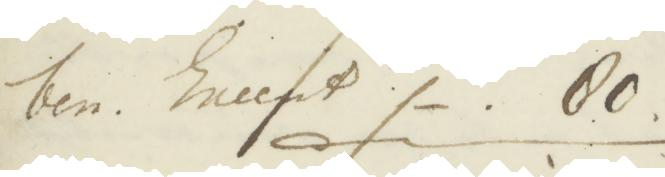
ben. Excut - . 80.
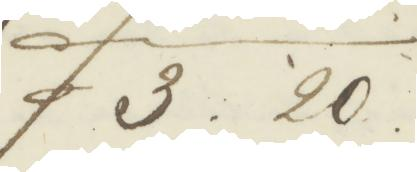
ƒ 3.20.
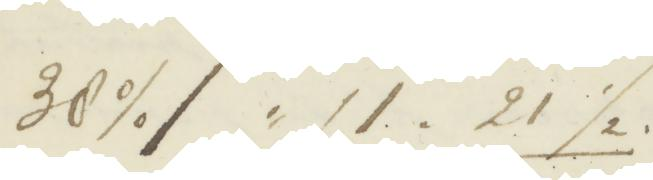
38% „ 1. 21 ½
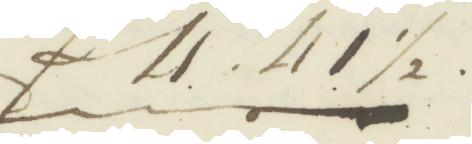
ƒ 4. 41½.
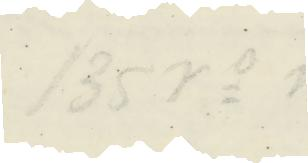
135 V=o v.7
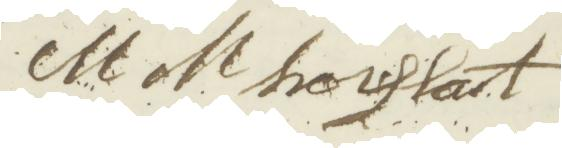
M M houssart
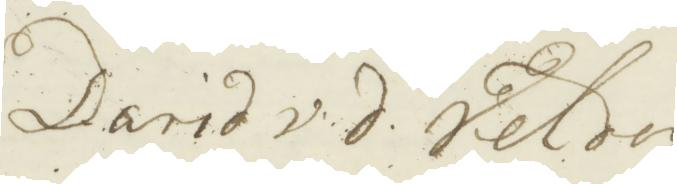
David v:d. Velden
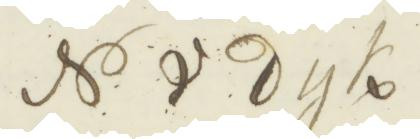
N: V: dyk
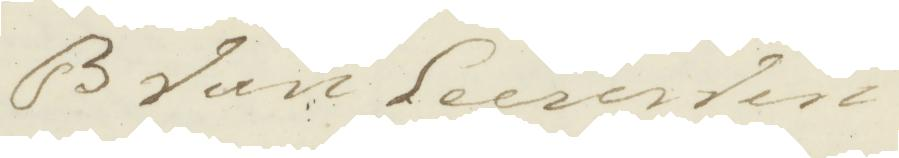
B Van Leeuwen
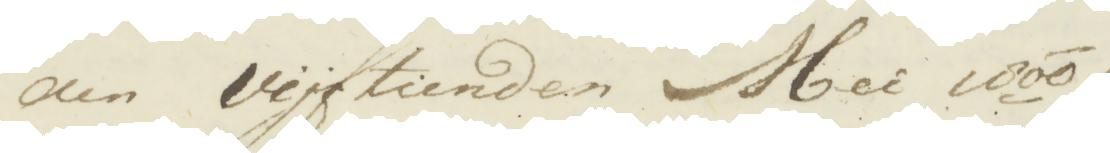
den Vijftienden Mei 1800.
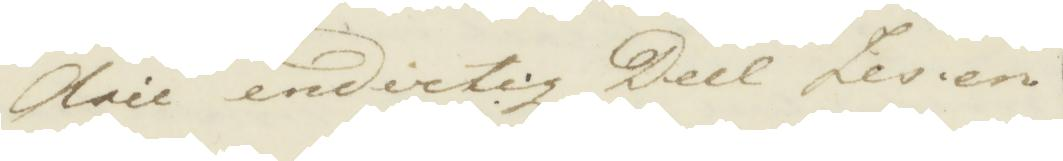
drie en dertig Deel Zes en
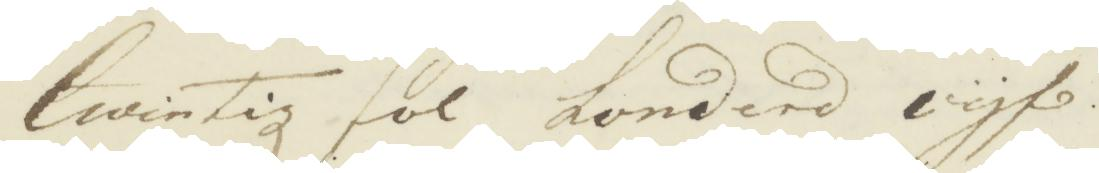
twintig fol honderd vijf.
